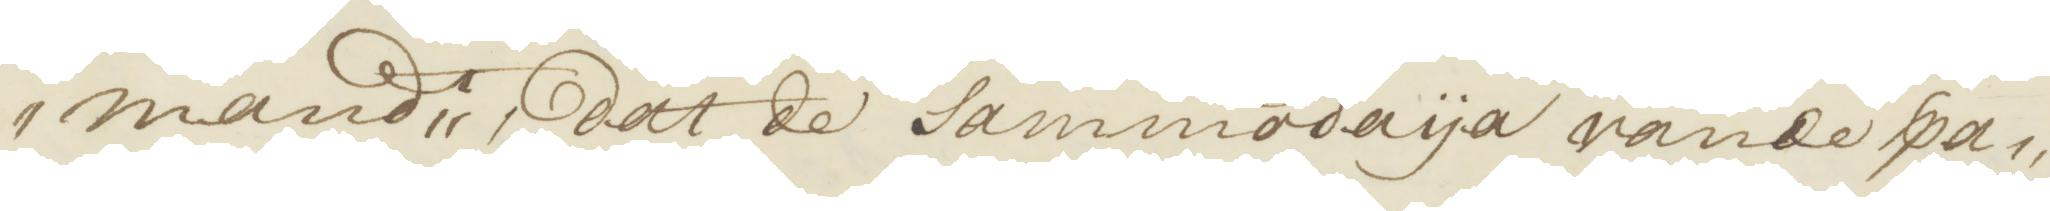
„mand„t, dat de sammodaija vande pa„
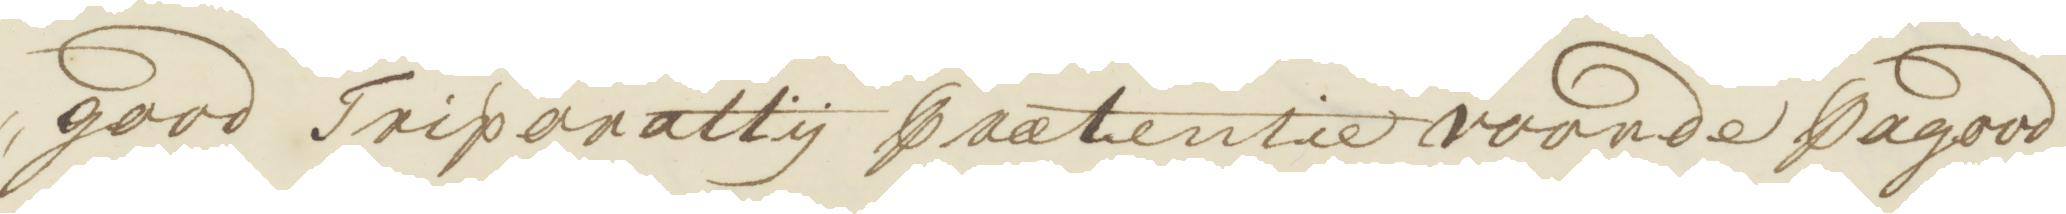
„good Triporattij praetentie voor de pagood
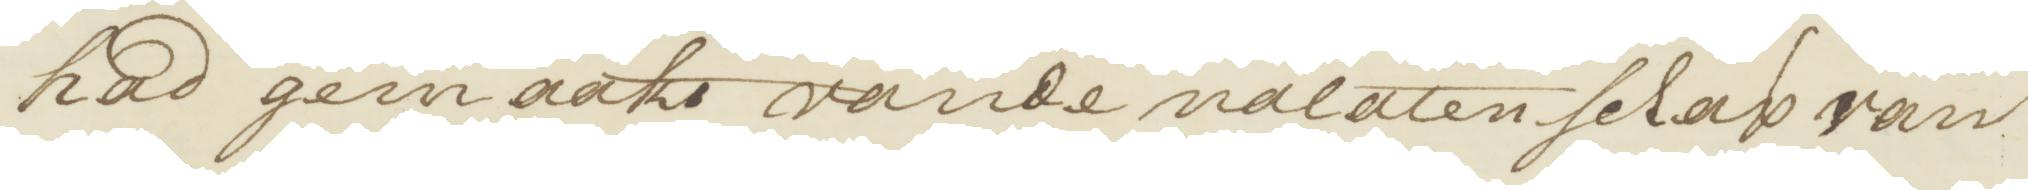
had gemaakt vande nalatenschap van
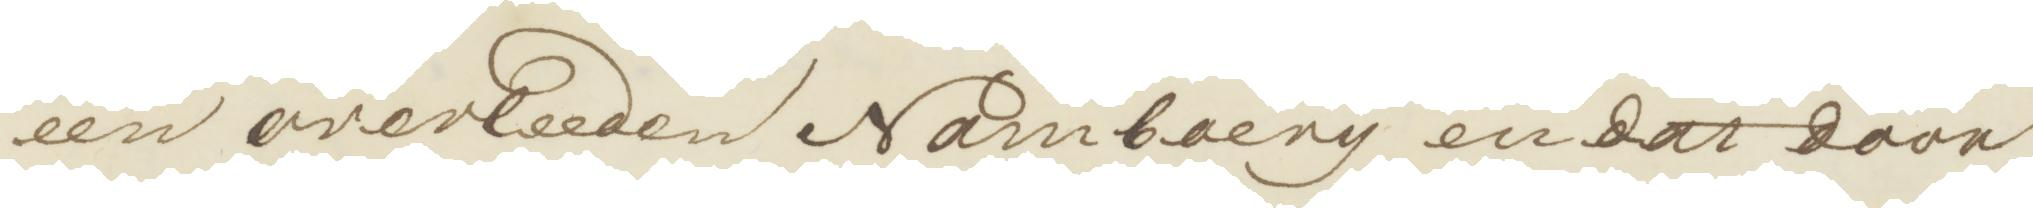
een overleeden Nambaerij en dat daar
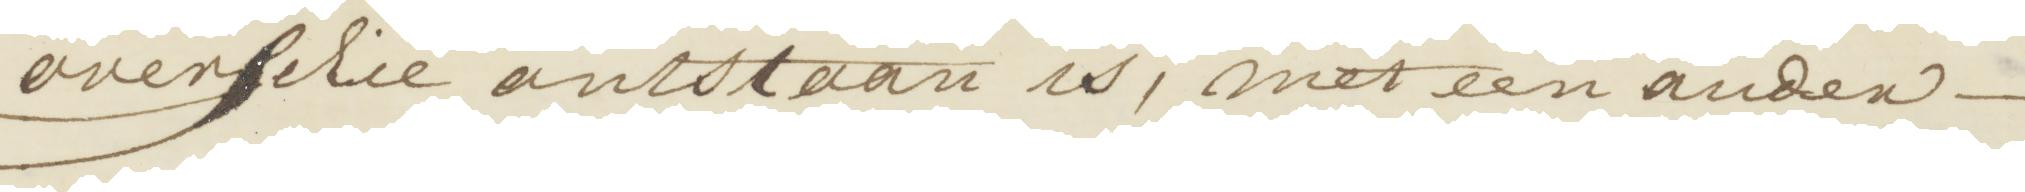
averschie ontstaan is, met een ander —
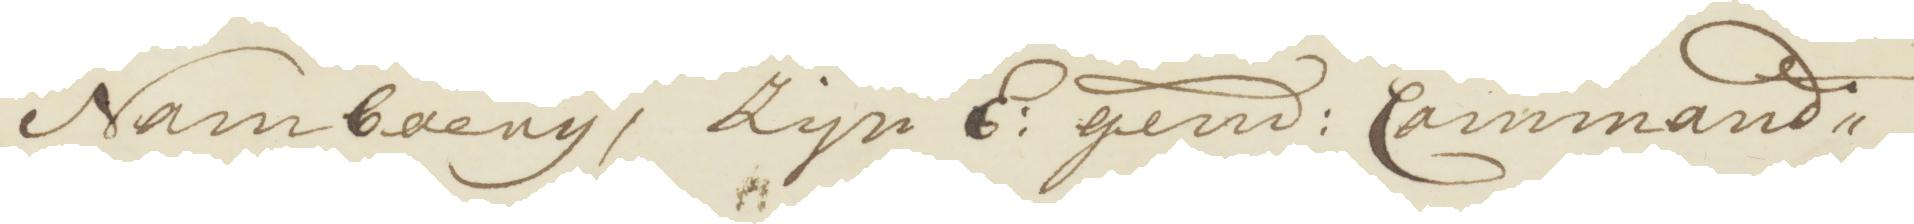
Nambaerij, zijn E: gem: Command„
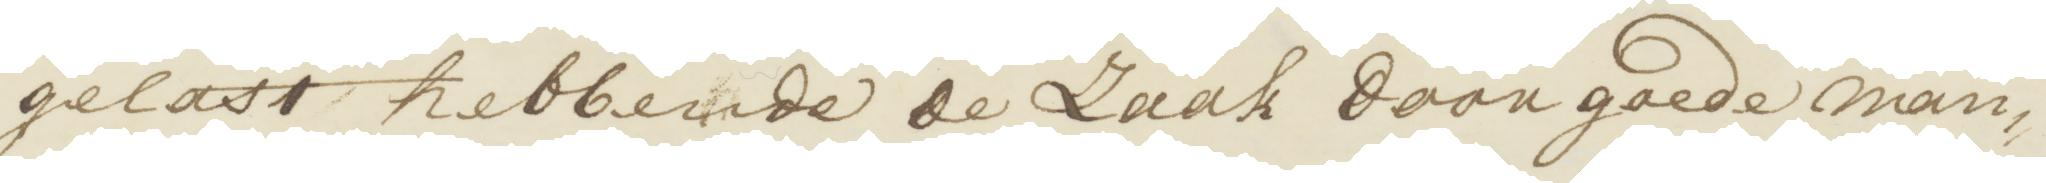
gelast hebbende de zaak door goede man„
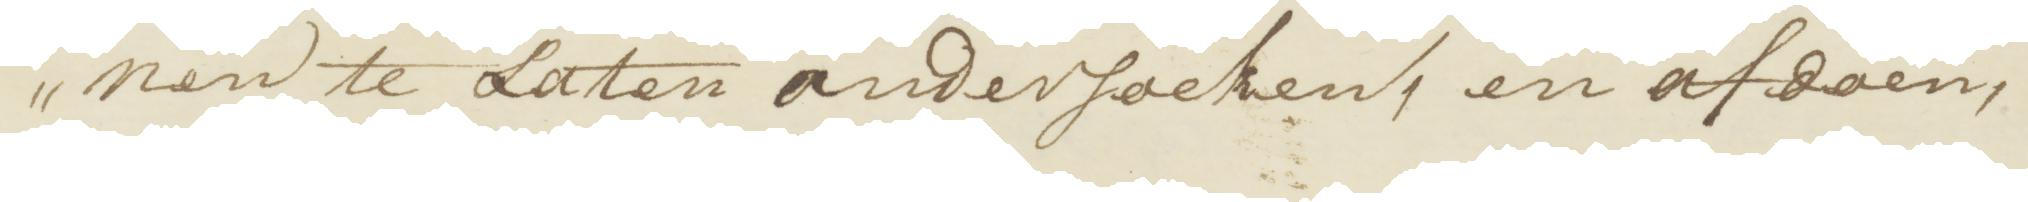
„nen te laten andersoeken, en afdoen,
